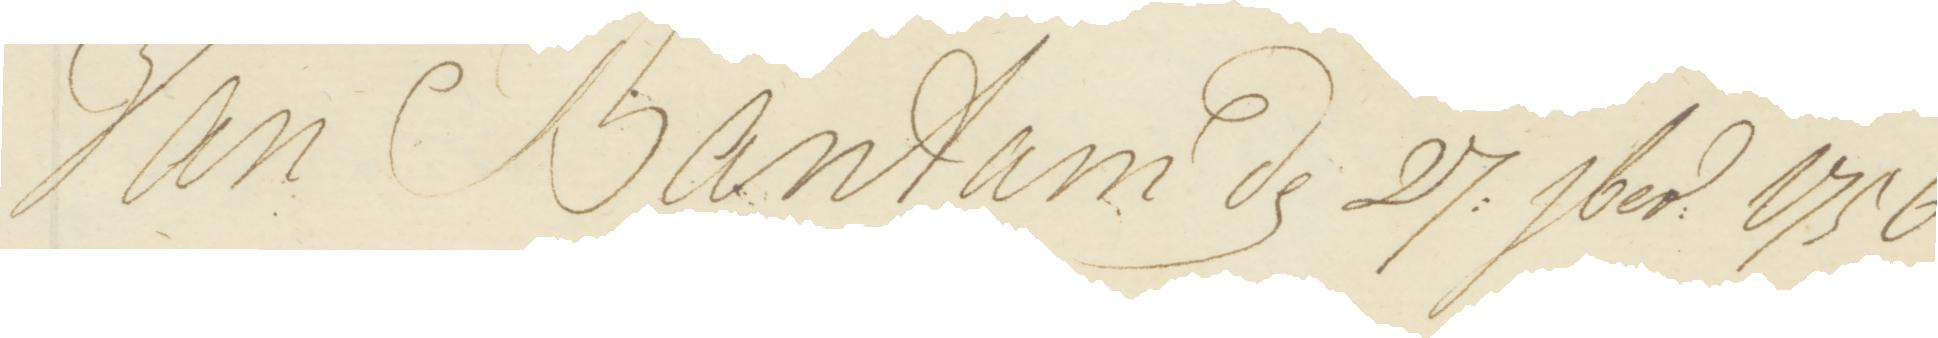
Van Bantam den 27: 7ber: 1756
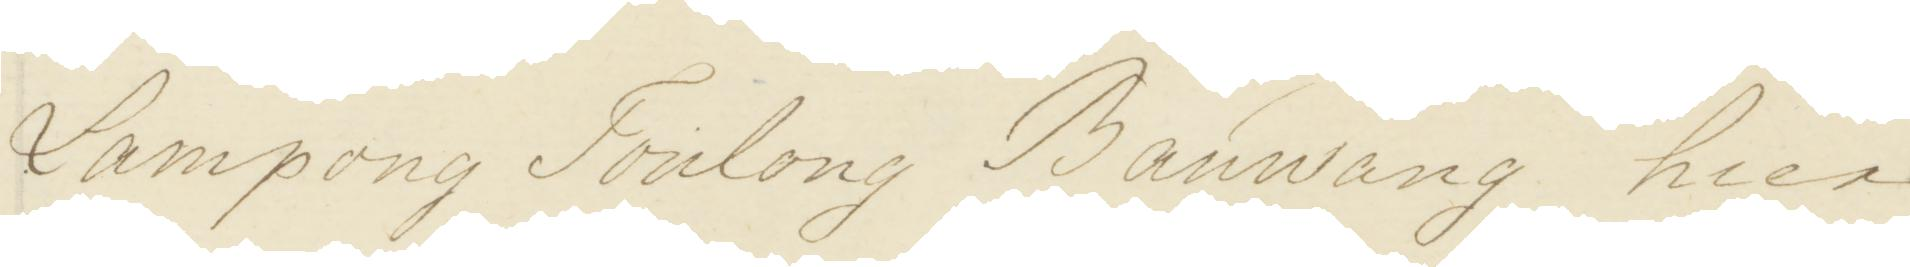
Lampong Toulong Bauwang hier
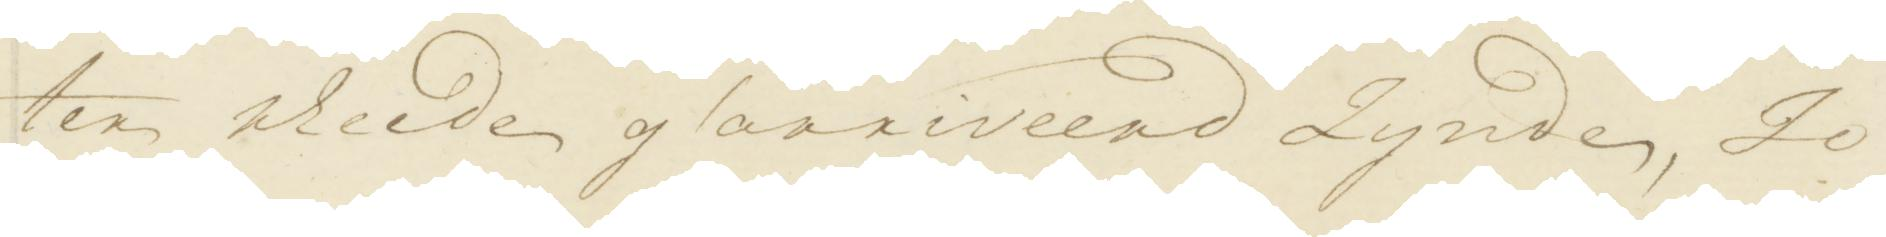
ter rheede g'arriveerd zijnde, zo
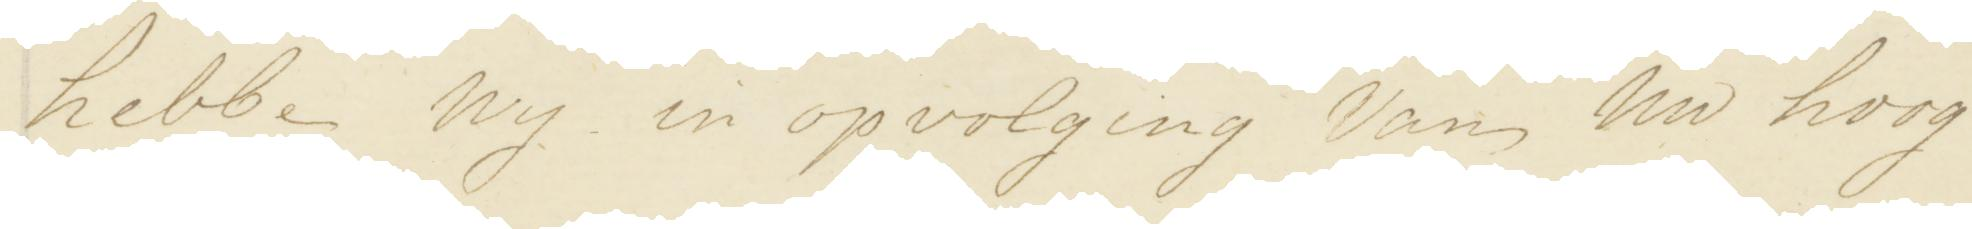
hebbe wy in opvolging van uw hoog
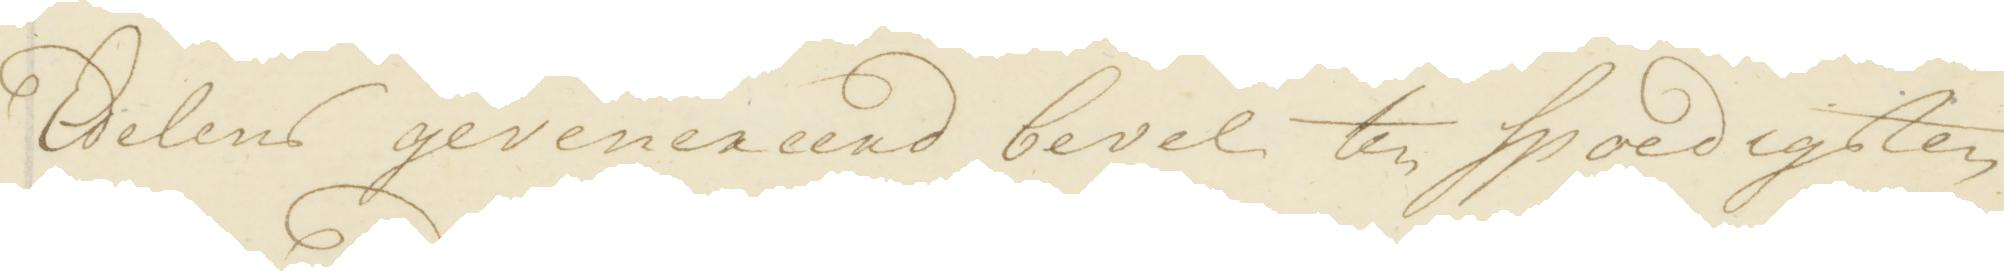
Edelens gevenereerd bevel ten spoedigsten
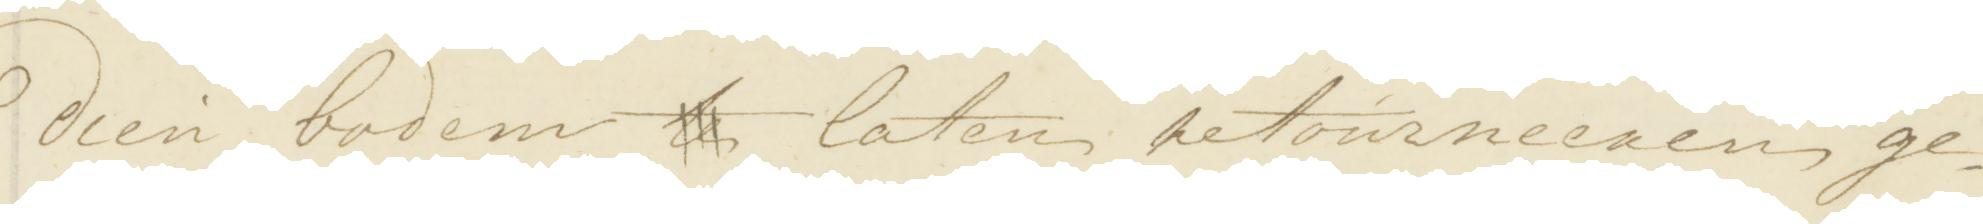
dien bodem te laten retourneeren ge=
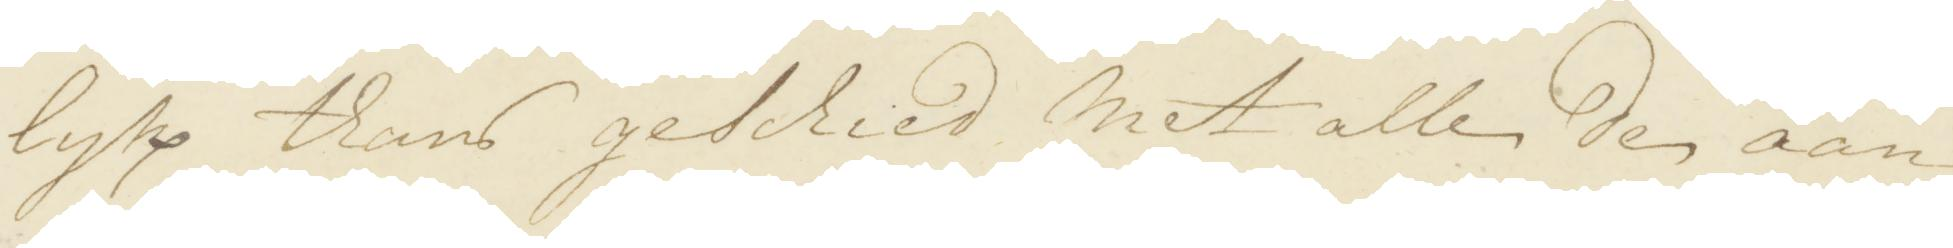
lyk thans geschied met alle de aan
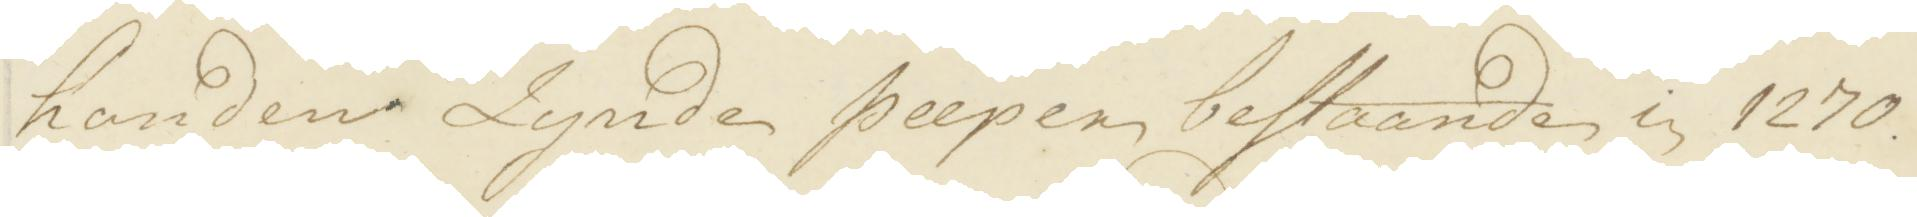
handen zynde peeper bestaande in 1270.
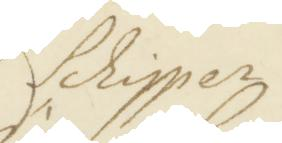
^schipper
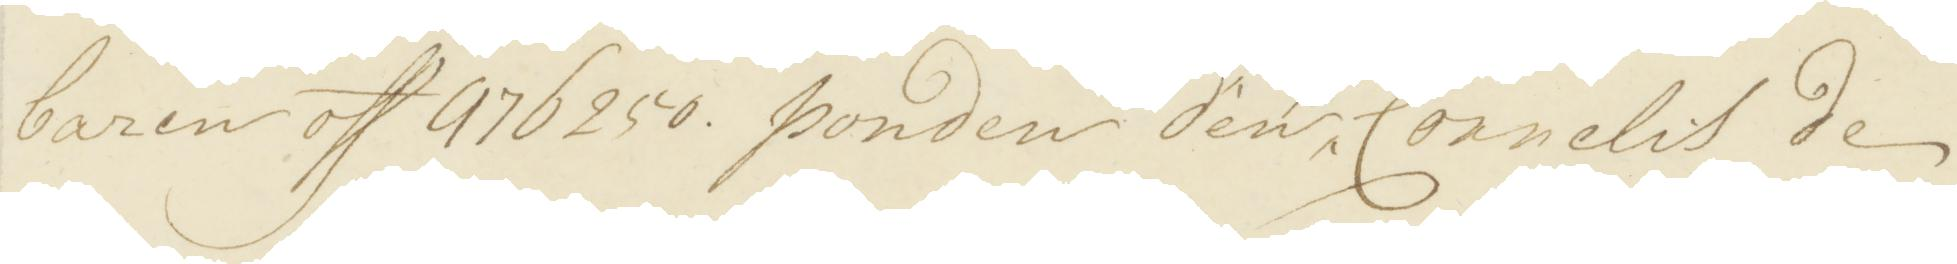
baren off 476250. ponden den ^ Cornelis de
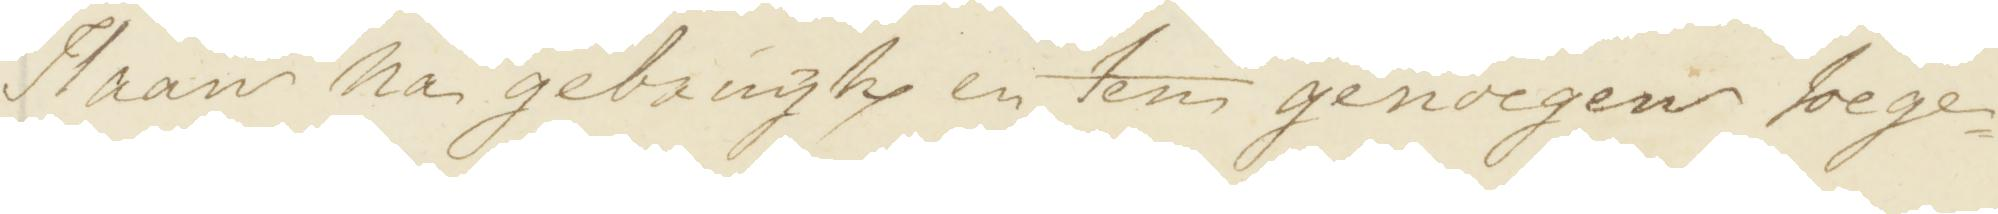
Haan na gebruijk en ten genoegen toege=
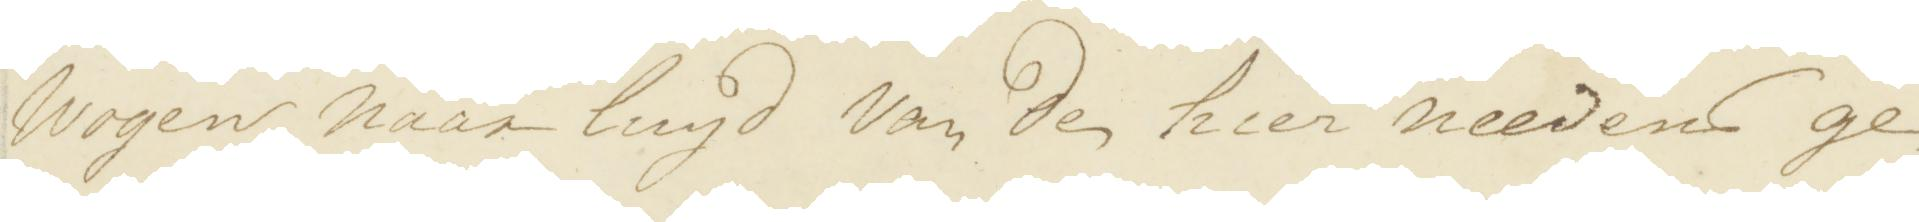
wogen, naar luyd van de hier neevens ge
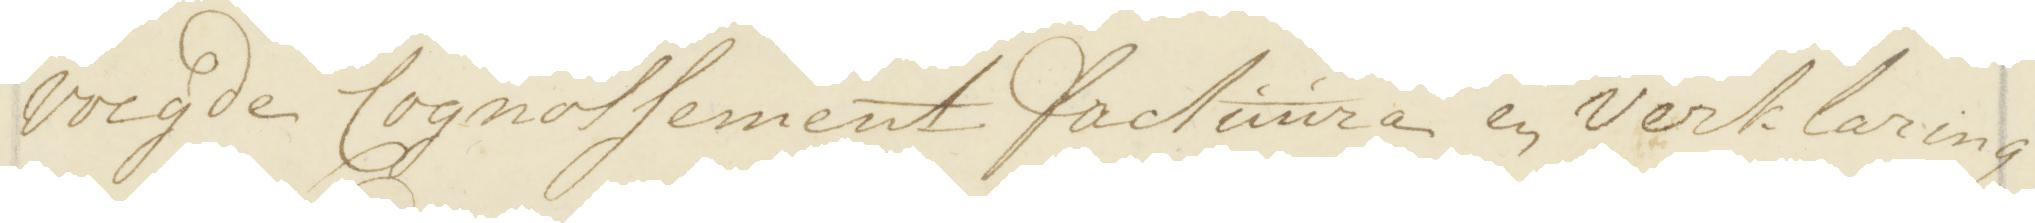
voegde Cognossement factuura en verklaring
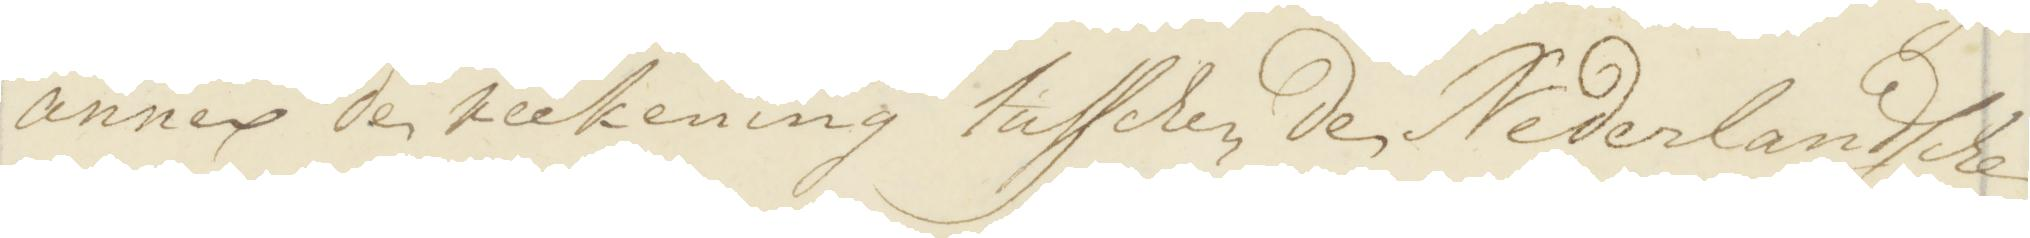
annex de reekening tusschen de Nederlandsche
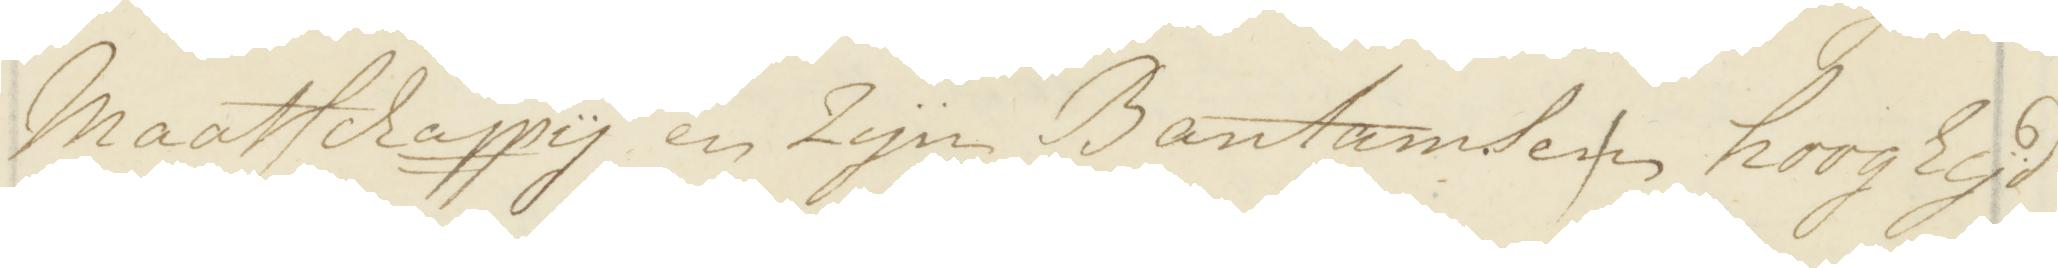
maatschappij en zijn Bantamsen hooghijd
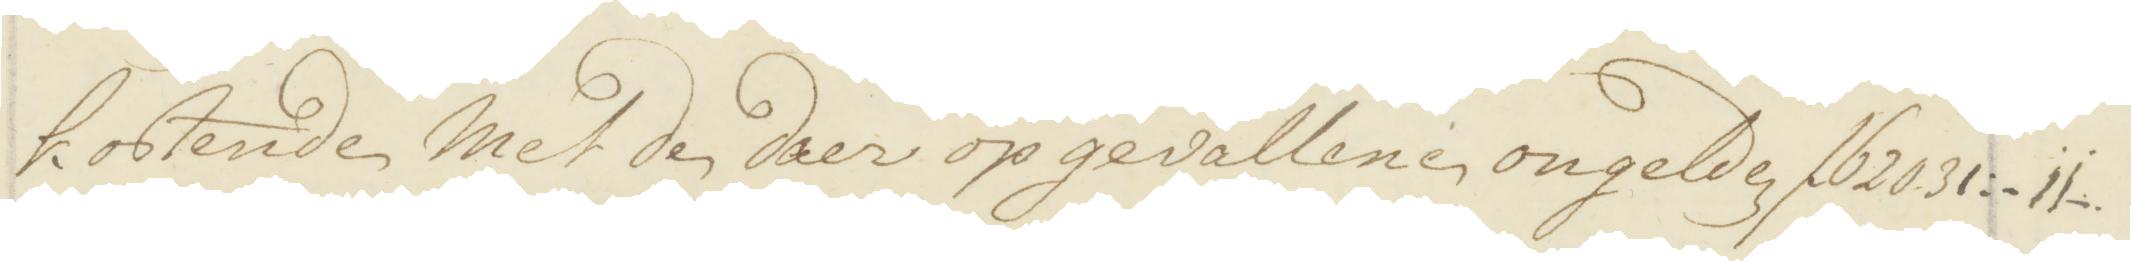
kostende met de daer op gevallene ongelden ƒ620.31:-11-.
